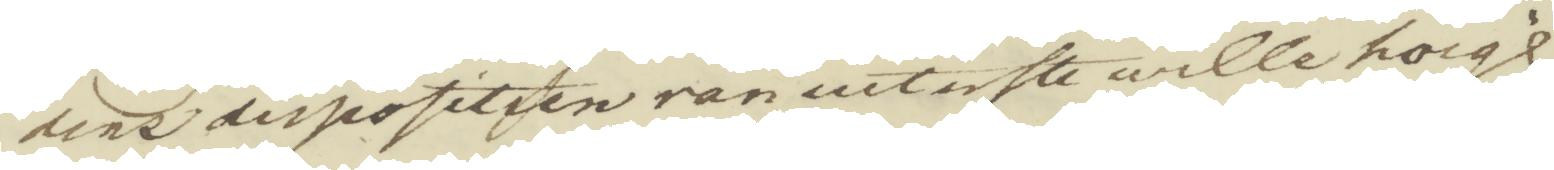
dere dispositien van uiterste wille hoege
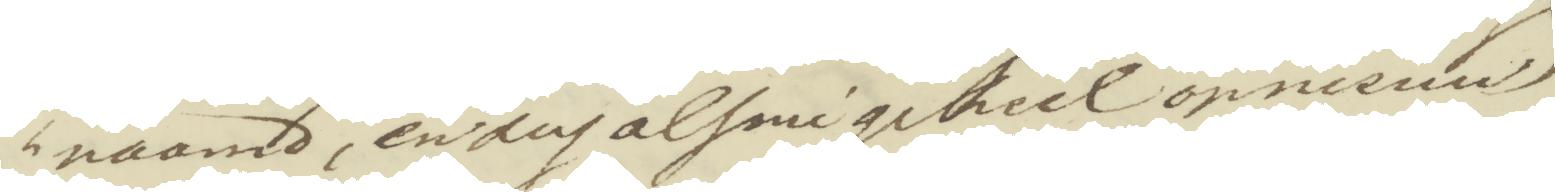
„naamd, en dus alsnu geheel opnieuw
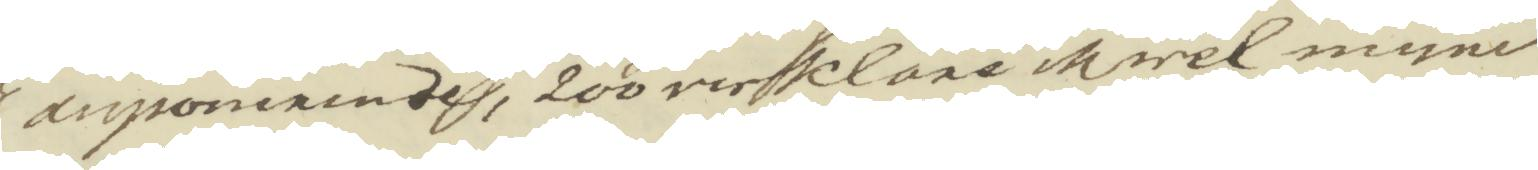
disponerende, zoo verklare ik wel myne
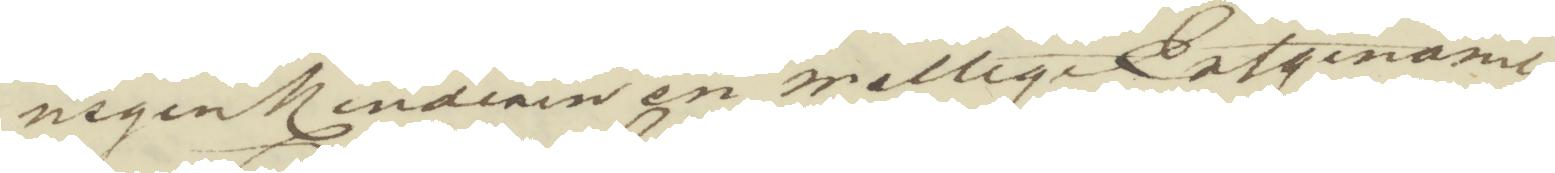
negen Kinderen en wettige Erfgenamen
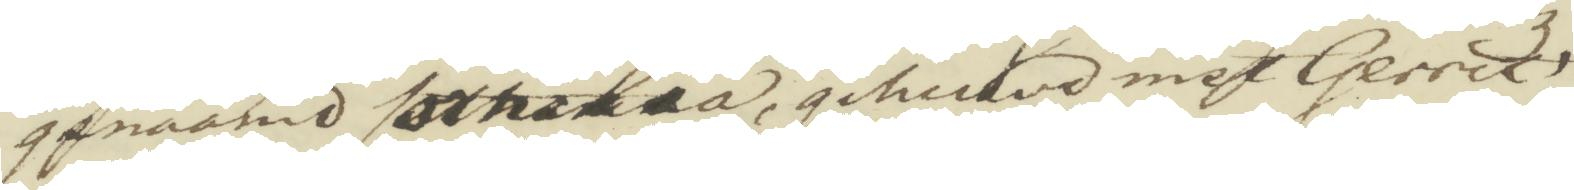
genaamd Cornelia, gehuwd met Gerrit
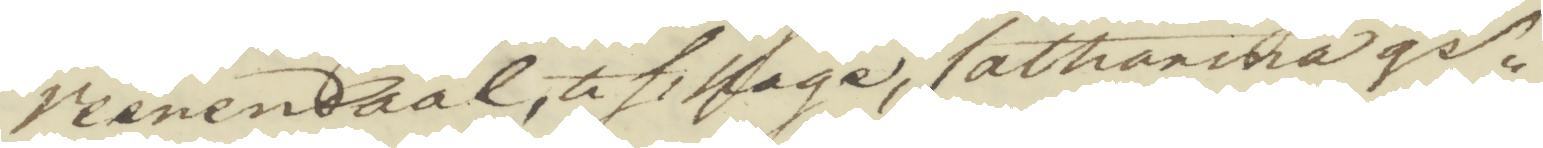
Veenendaal, te S'Hage, Catharina ge„
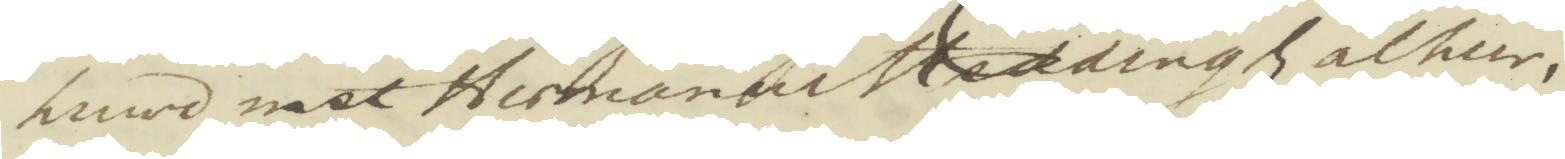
huwd met Hermanus Heddingh alhier,
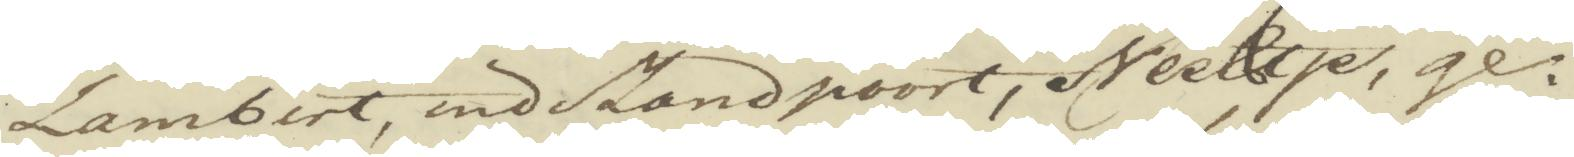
Lambert, inde Zandpoort, Neeltje, ge„
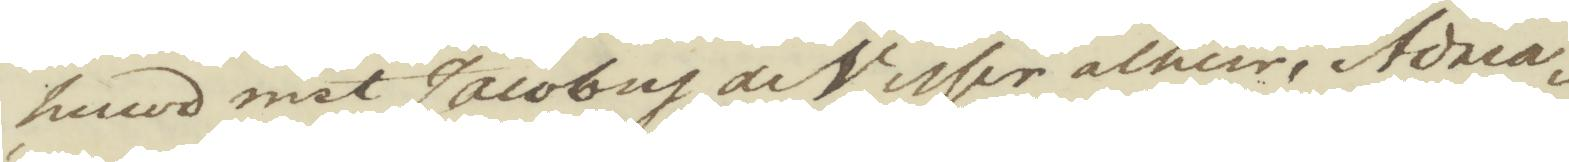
huwd met Jacobus de Visser alhier, Adria
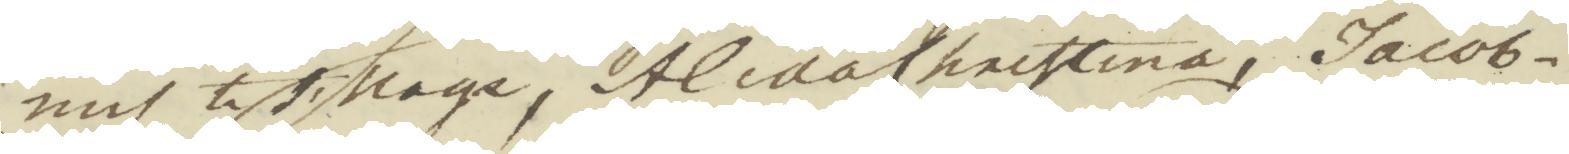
nus te s:Hage, Alida Christina, Iacob-
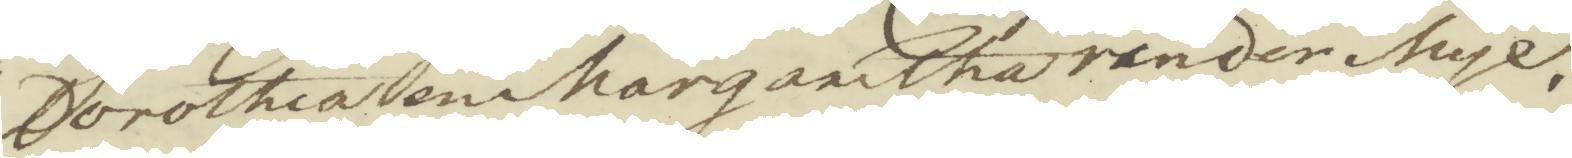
Dorothea en Margaritha vander Mye,
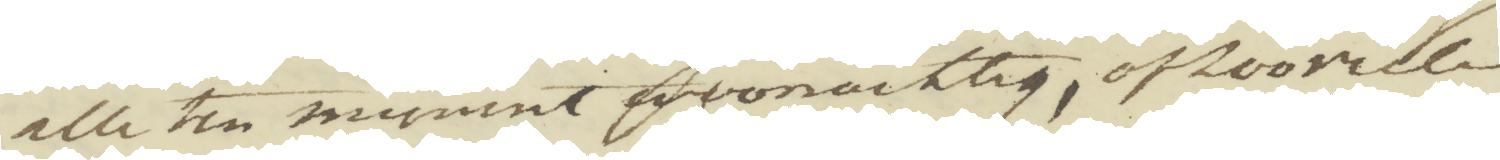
alle ten mynent woonachtig, of zooveele
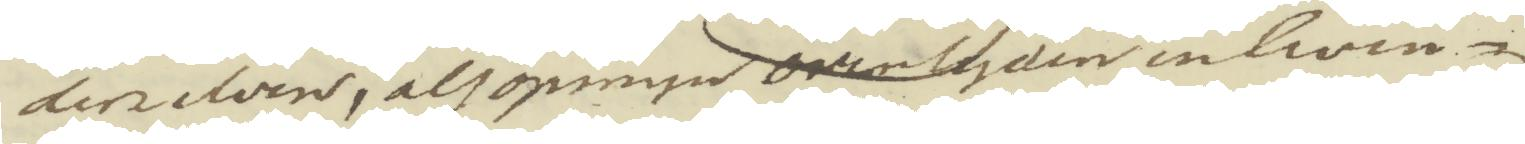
derzelven, als op myn overlyden in leven
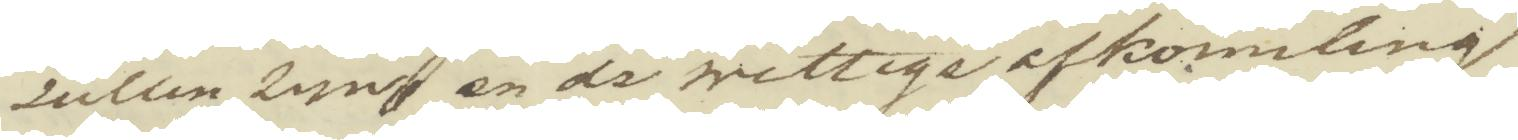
zullen zyn en de wettige afkomeling
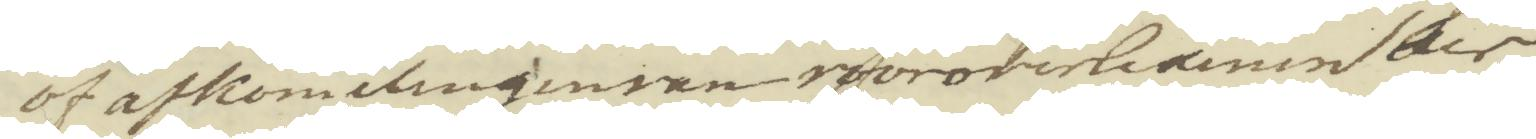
of afkomelingen van vooroverledenen der
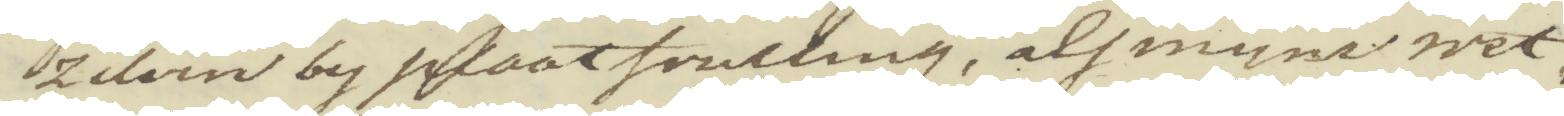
zelven by plaatsvulling, als myne wet
